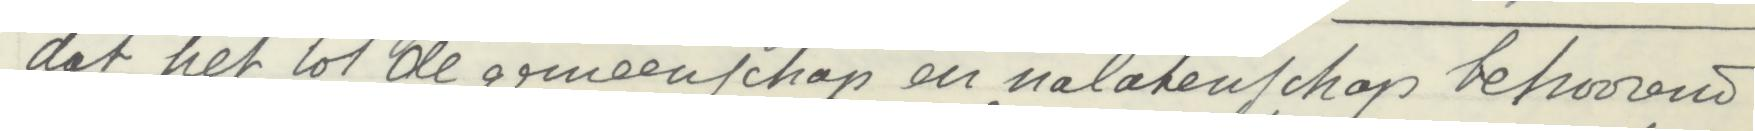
dat het tot de gemeenschap en nalatenschap behoorend
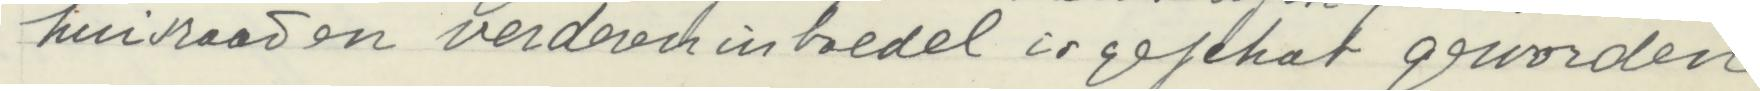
huisraad en verderen in boedel is geschat geworden
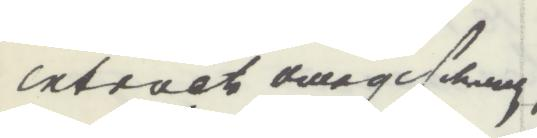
extract overschryving
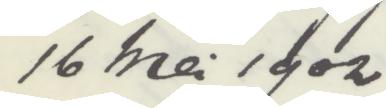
16 mei 1902
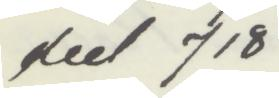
deel 718
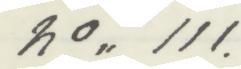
No„ 111.
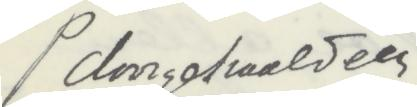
¶ doorgehaald een
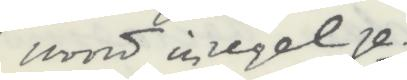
woord in regel ze
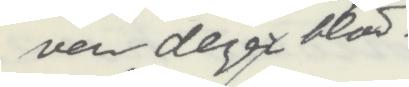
ven dezer blad
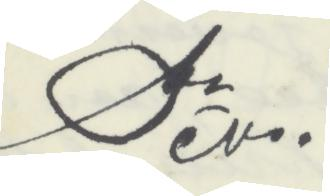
J=s no.
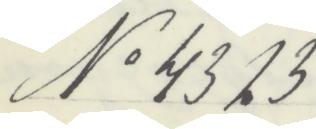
No 4323
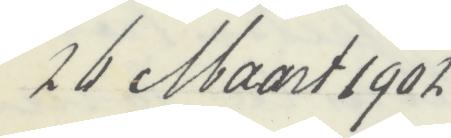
24 Maart 1902
